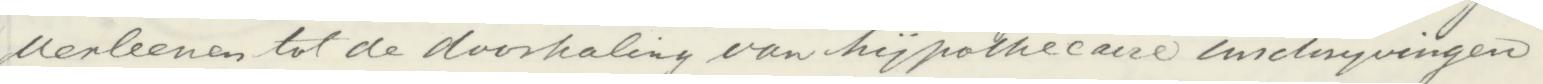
verleenen tot de doorhaling van hijpothecaire inschrijvingen
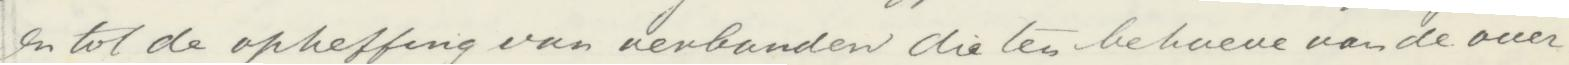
en tot de opheffing van verbanden die ten behoeve van de over
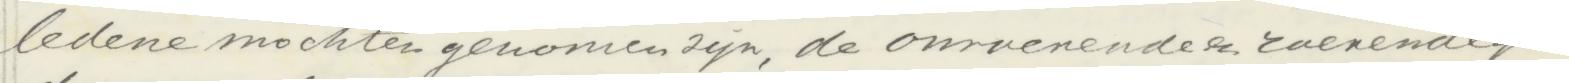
ledene mochten genomen zijn, de onroerende en roerende goe
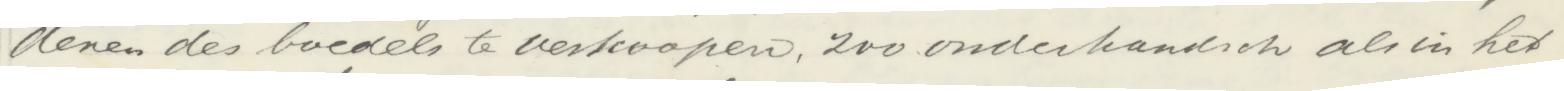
deren des boedels te verkoopen, zoo onderhandsch als in het
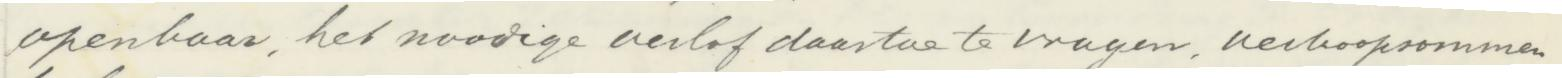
openbaar, het noodige verlof daartoe te vragen, verkoopsommen
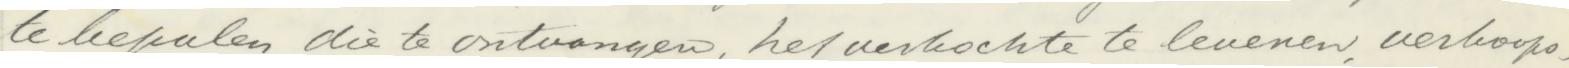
te bepalen, die te ontvangen, het verkochte te leveren, verkoops
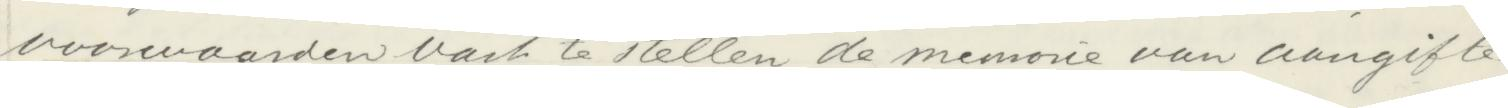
voorwaarden vast te stellen, de memorie van aangifte
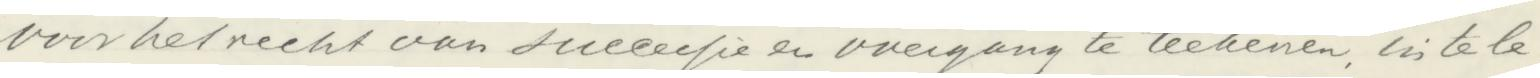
voor het recht van successie en overgang te teekenen, in te le
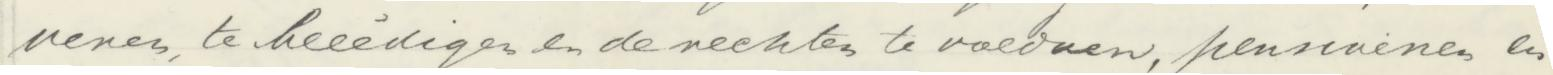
veren, te beeëdigen en de rechten te voldoen, pensioenen en
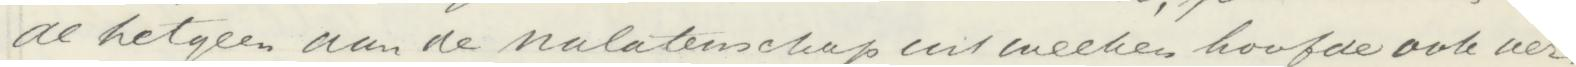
al hetgeen aan de nalatenschap uit welken hoofde ook ver
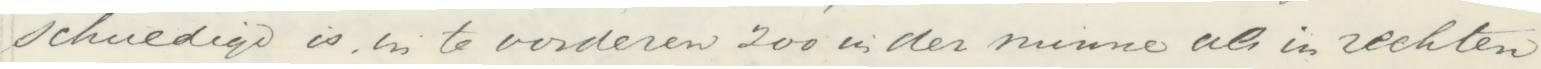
schuldigd is, in te vorderen zoo in der minne als in rechten
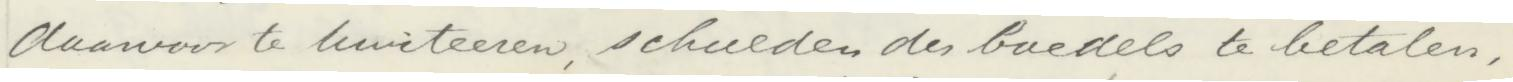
daarvoor te kwiteeren, schulden des boedels te betalen,
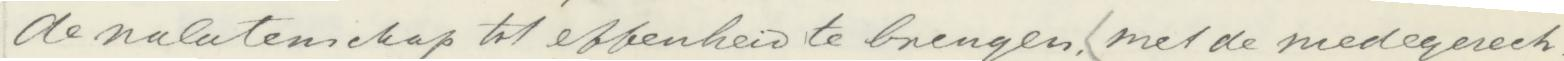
de nalatenschap tot effenheid te brengen, met de medegerech
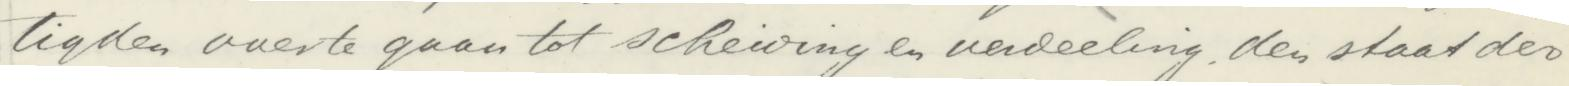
tigden over te gaan tot scheiding en verdeeling, den staat der
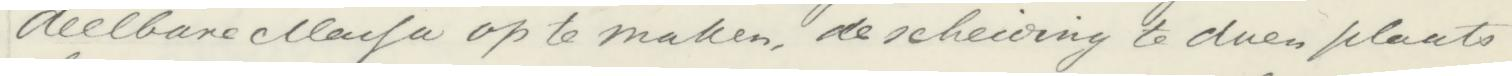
deelbare Massa op te maken, de scheiding te doen plaats
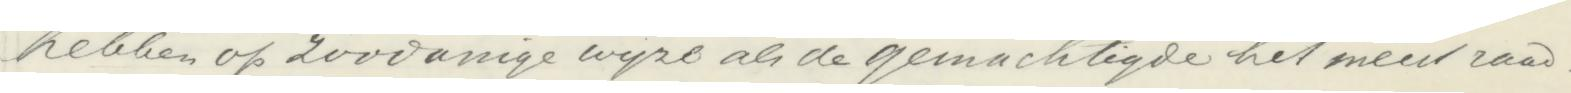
hebben op zoodanige wijze als de gemachtigde het meest raad
